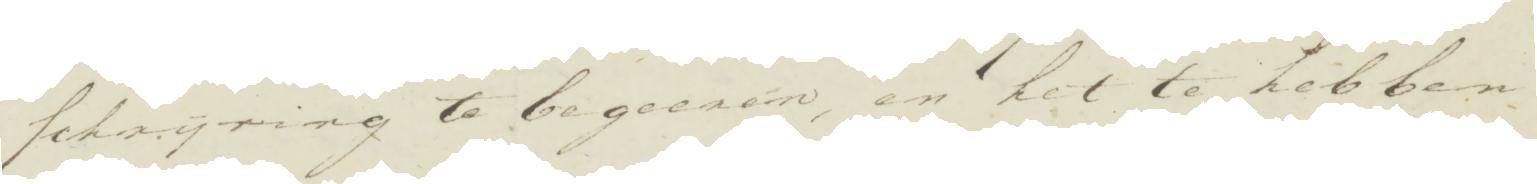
schrijving te begeeren, en het te hebbe
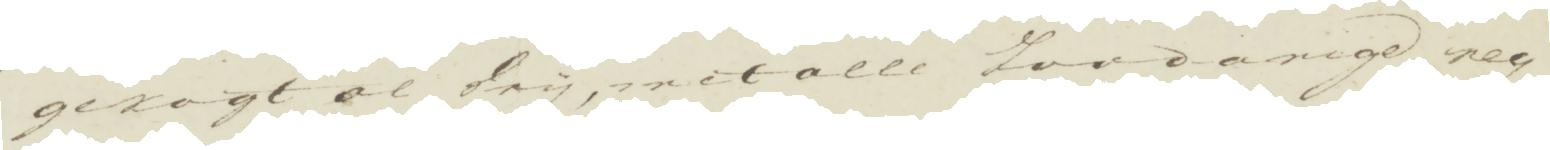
gekogt al vrij, met alle zoodanige reg
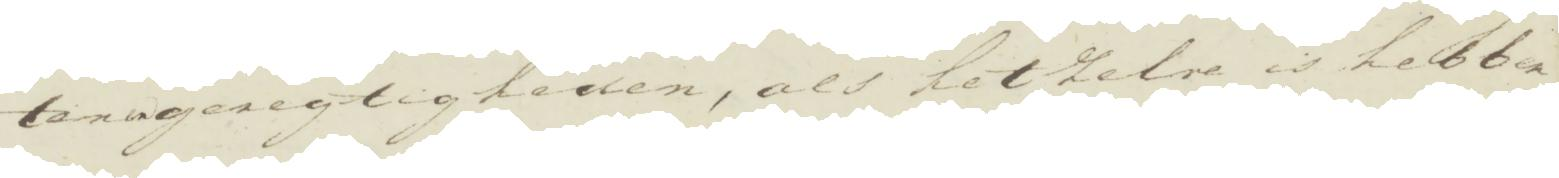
ten en geregtigheden, als hetzelve is hebben
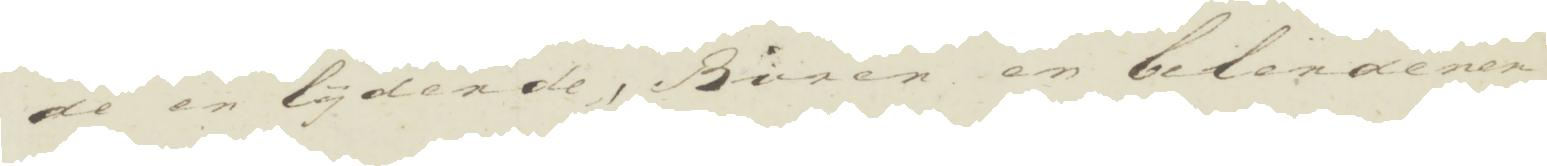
de en lijdende, Boven en belendenen
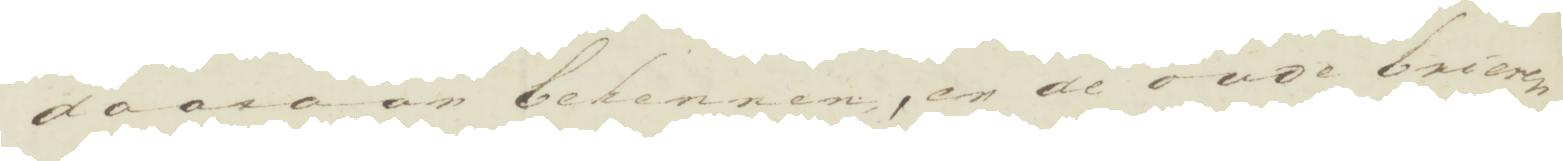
daaraan bekennen, en de oude brieven
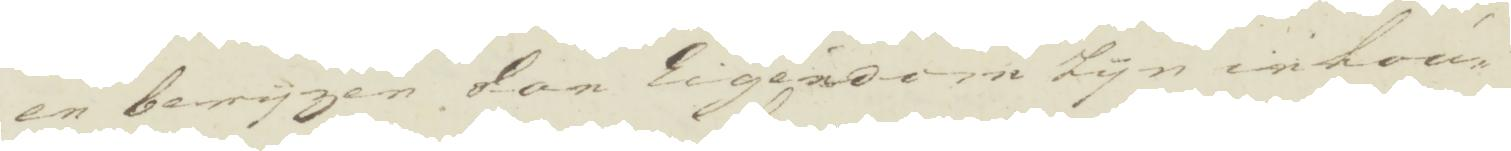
en bewijzen van Eigendom zijn inhou„
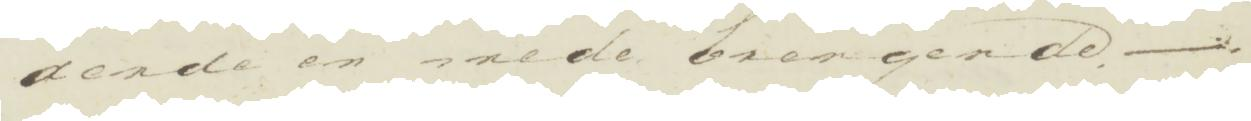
dende en mede brengende —.
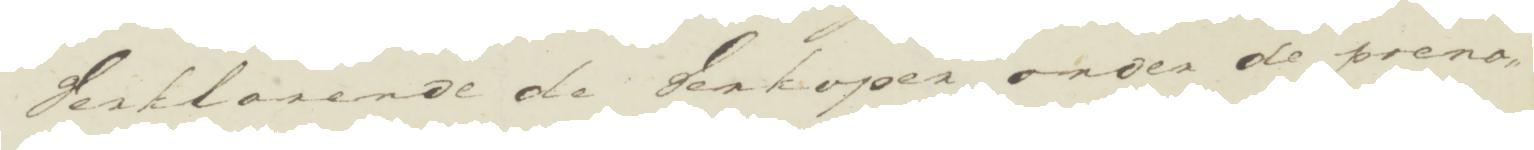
Verklarende de verkoper onder de prena„
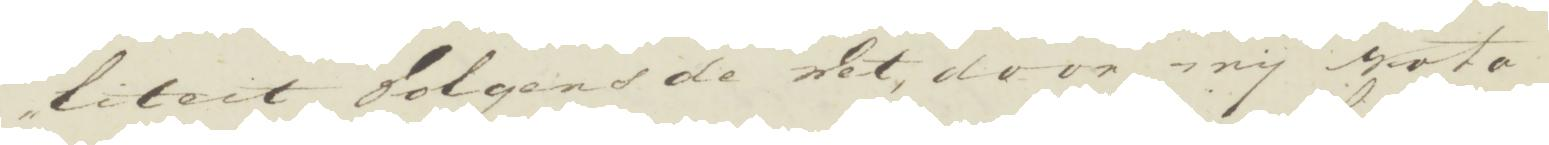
„liteit volgens de wet, door mij Nota
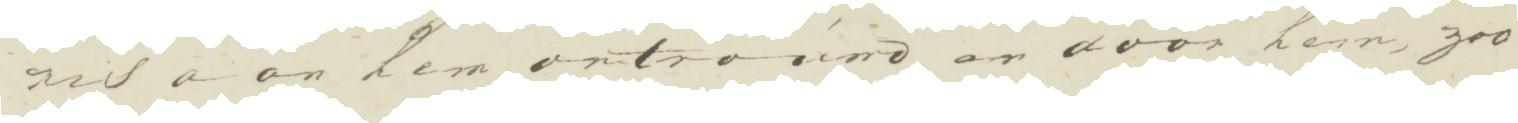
ris aan hem ontvouwd, en door hem, zoo
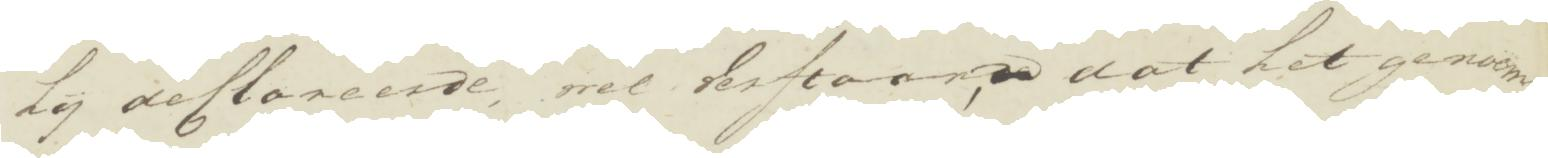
hij declareerde, wel verstaan, dat het genoem
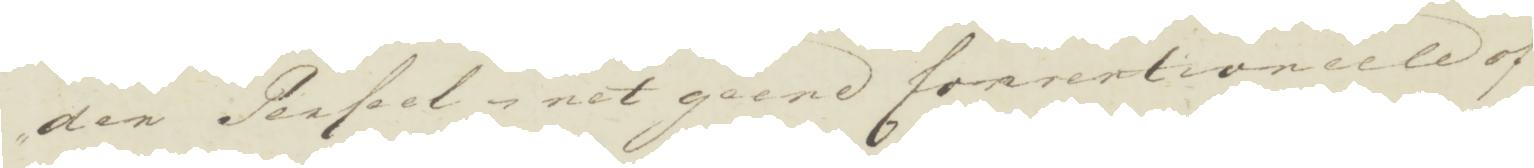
„den Perceel met geene conventioneele of
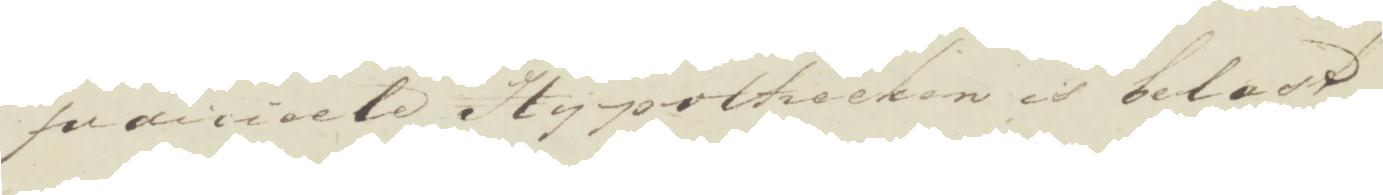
Judicieele Hypotheeken is belast,
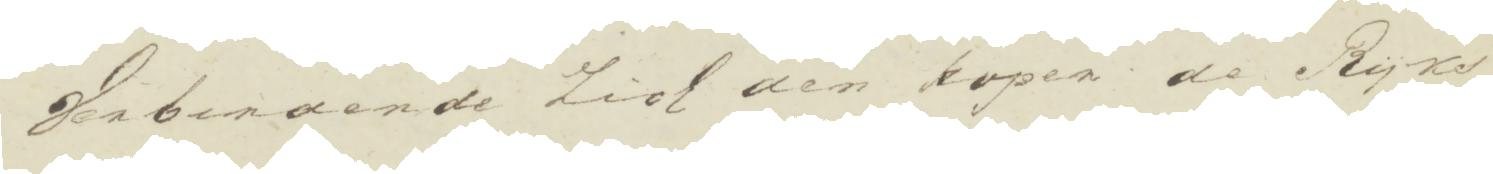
Verbindende zich den koper de Rijxs
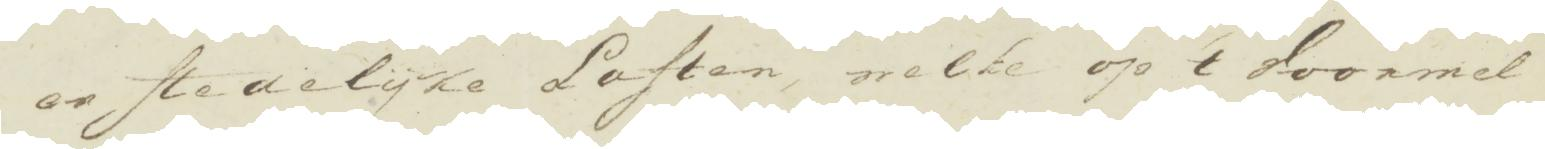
en stedelijke Lasten, welke op ’t voormel
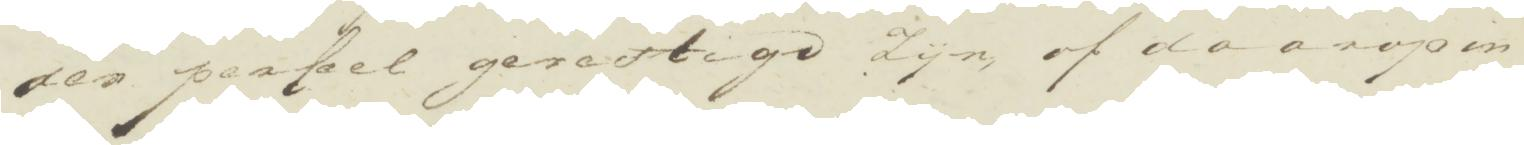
den perceel gevestigd zijn, of daarop in
